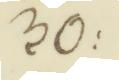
30: d:-os
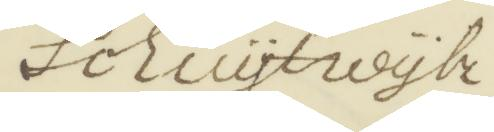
schuijtwijk
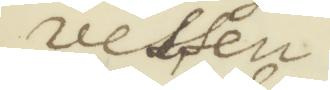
velsen
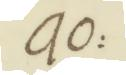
40:
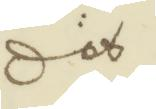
do:s
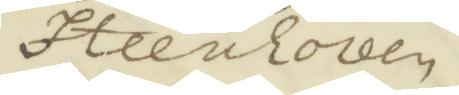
Steenhoven
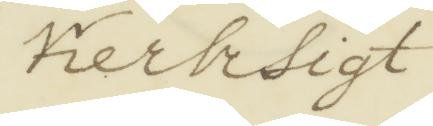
Kerksigt
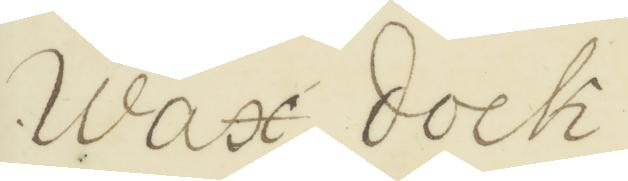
Wax doek
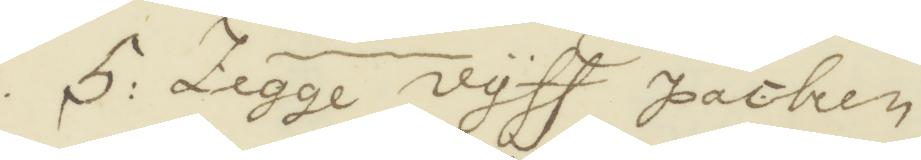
5: zegge vijff packen
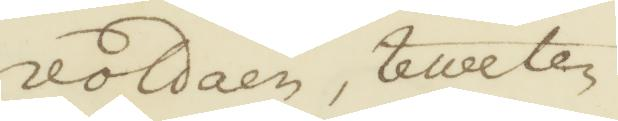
voldaen, teweten
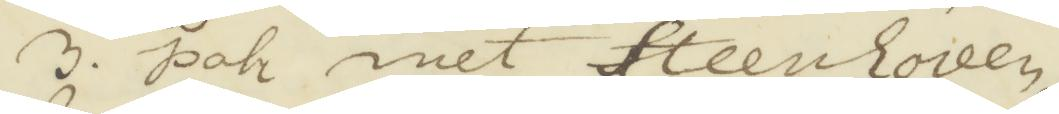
3. pak met steenhoven
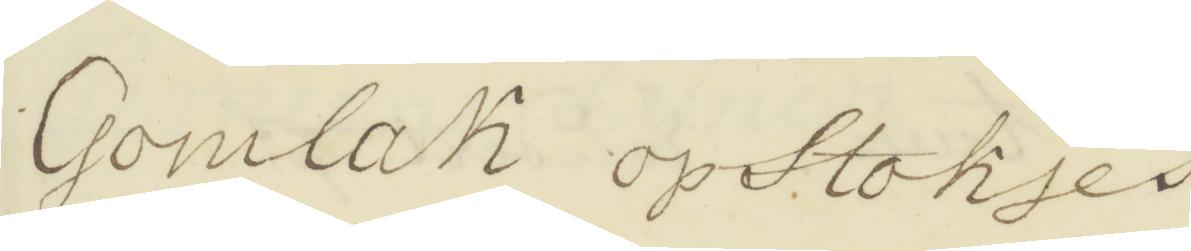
Gomlak opstokjes
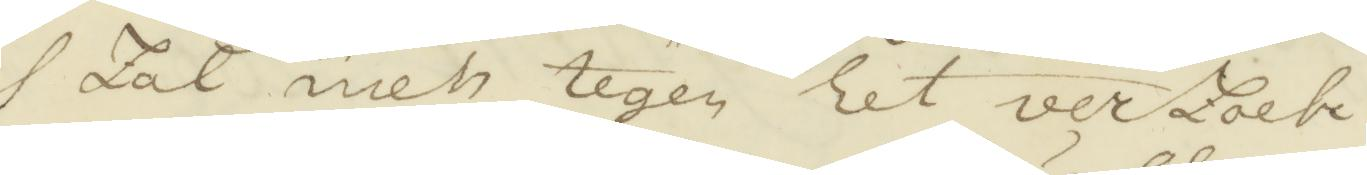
zal niet tegen het verzoek
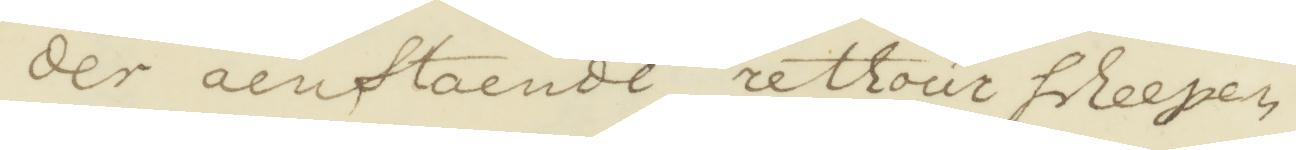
der aenstaende rethour scheepen
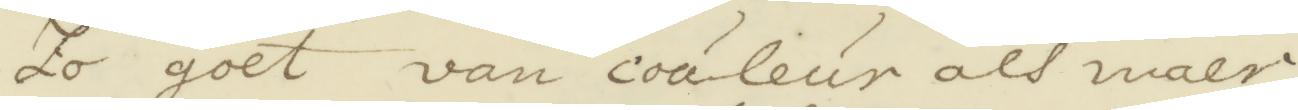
zo goet van couleur als maer
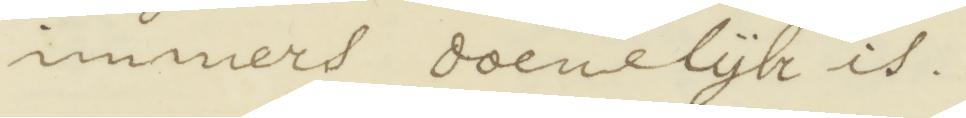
immers doenelijk is.
